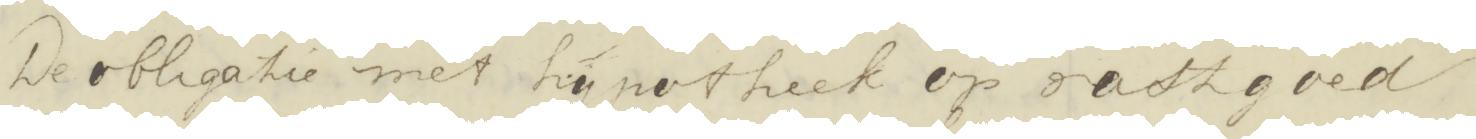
De obligatie met hijpotheek op vastgoed
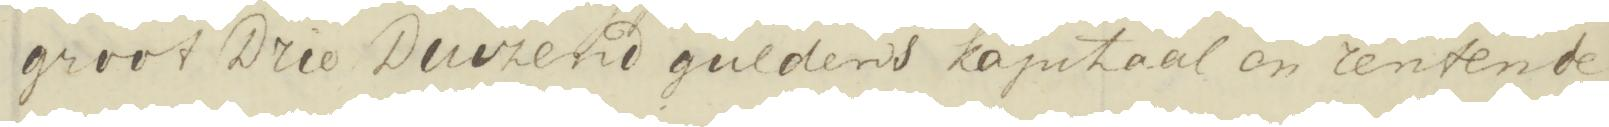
groot Drie Duizend guldens kapitaal en rentende
